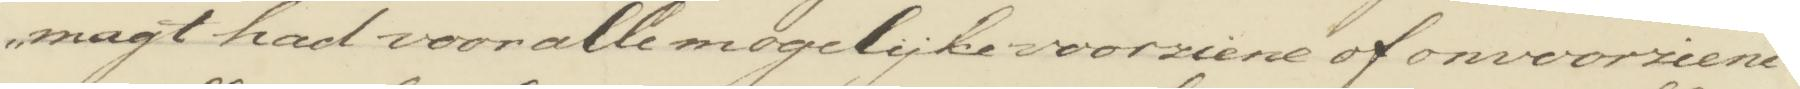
„magt had voor alle mogelijke voorziene of onvoorziene
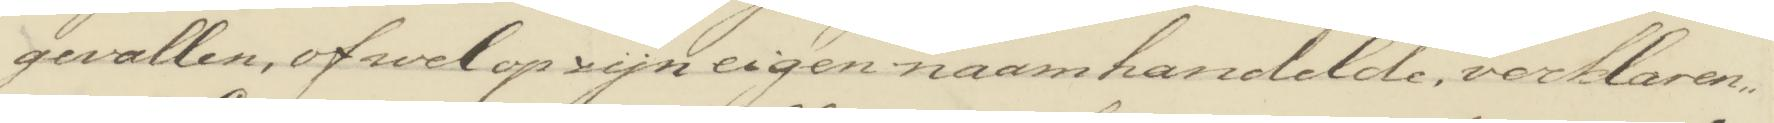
gevallen, of wel op zijn eigen naam handelde, verklaren„
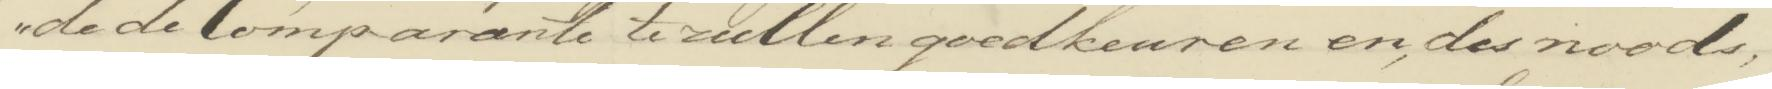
„de de Comparante te zullen goedkeuren en, des noods,
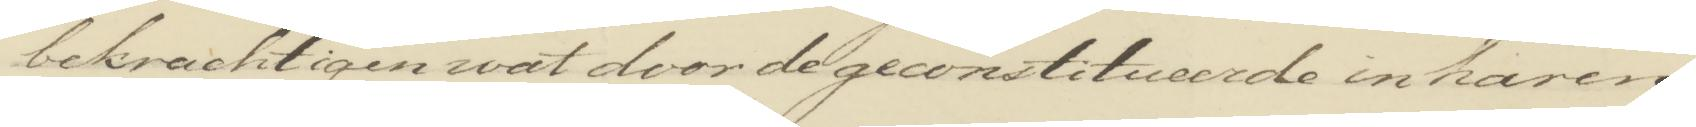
bekrachtigen wat door de geconstitueerde in haren
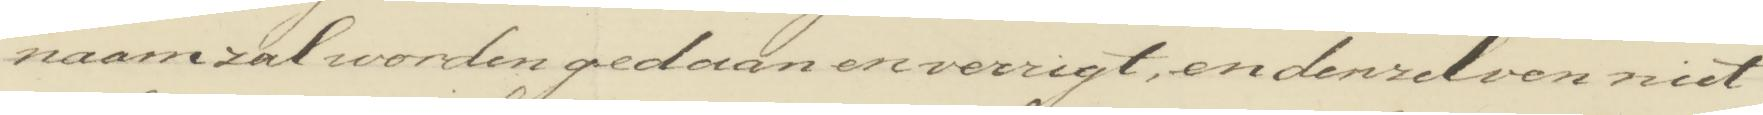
naam zal worden gedaan en verrigt, en denzelven niet
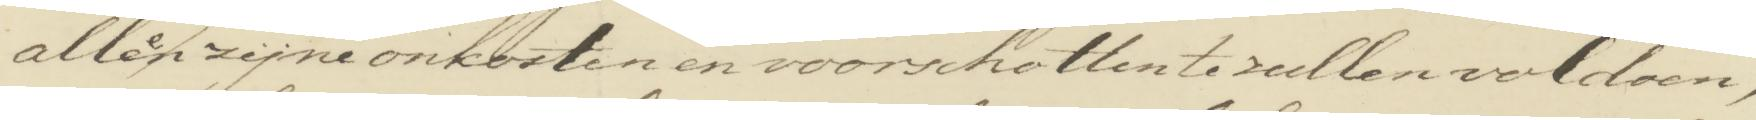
alleen zijne onkosten en voorschotten te zullen voldoen
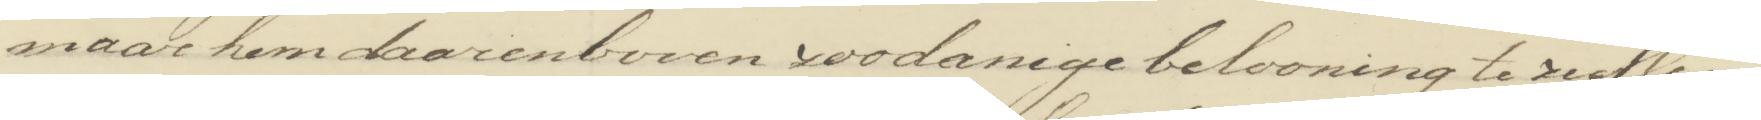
maar hem daaren boven zoodanige belooning te zullen
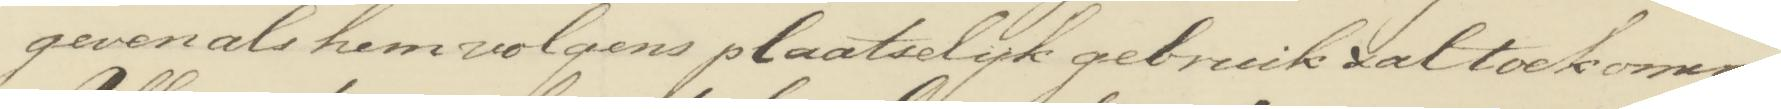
geven als hem volgens plaatselijk gebruik zal toekomen.
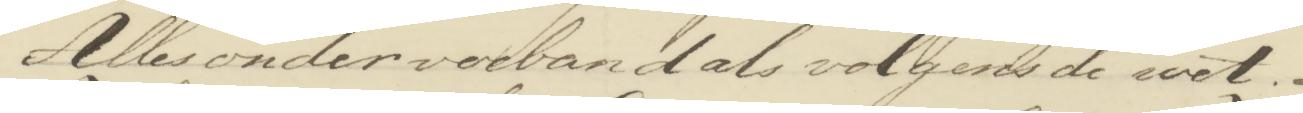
Alles onder verband als volgens de wet..
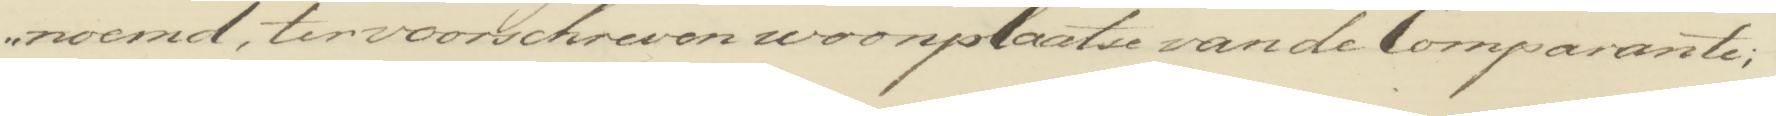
„noemd, ter voorschreven woonplaatse van de Comparante
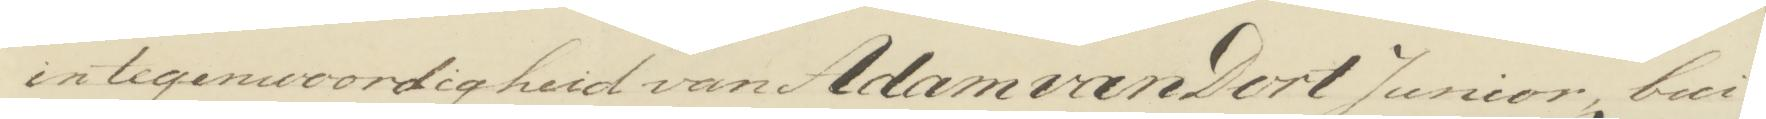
in tegenwoordigheid van Adam van Dort Junior, bui
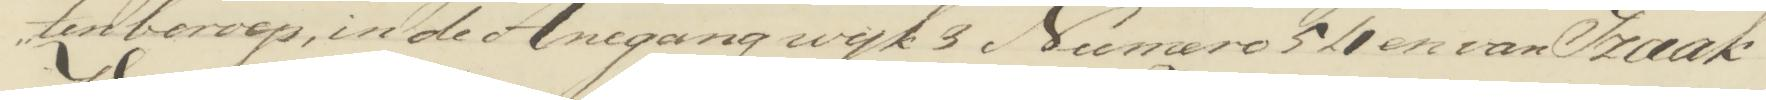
„ten beroep, in de Anegang wijk 3 Numero 54 en van Izaak
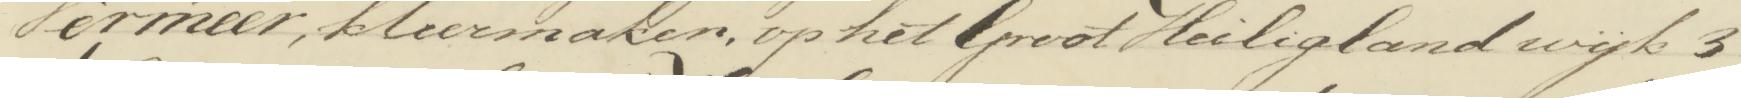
Vermeer, kleermaker, op het Groot Heiligland wijk 3
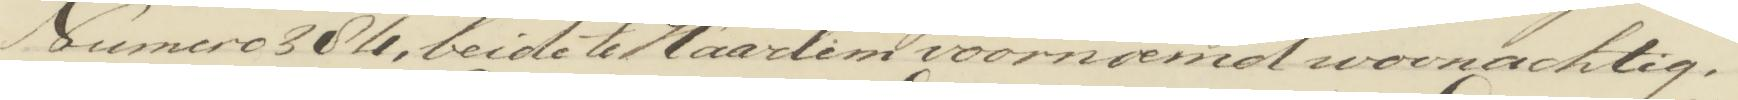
Numero 384, beide te Haarlem voornoemd woonachtig,
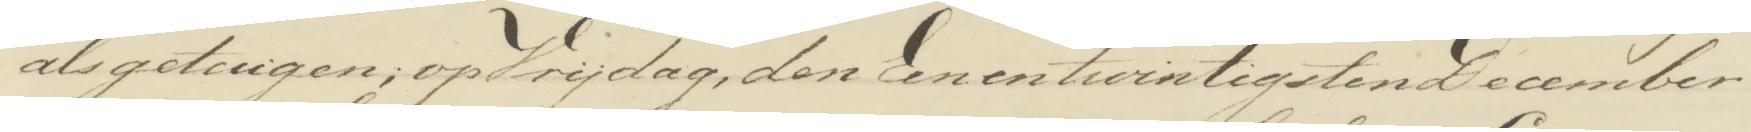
als getuigen, op Vrijdag, den Een en twintigsten December
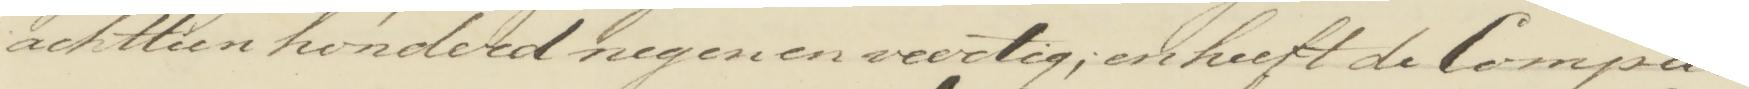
achttien honderd negen en veertig; en heeft de Compa
